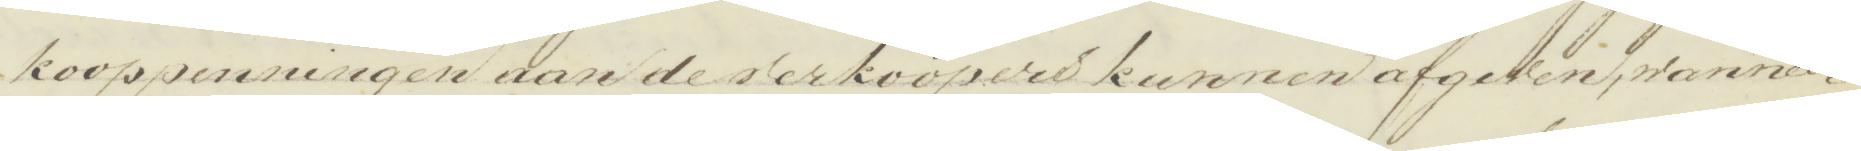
kooppenningen aan de verkoopers kunnen afgeven, wanneer
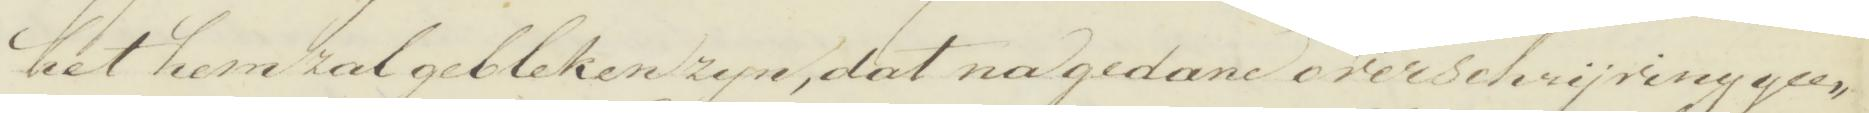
het hem zal gebleken zyn, dat na gedane overschrijving geen
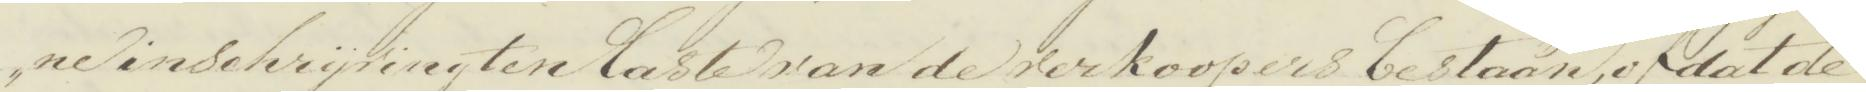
„ne inschrijving ten laste van de verkoopers bestaan, of dat de
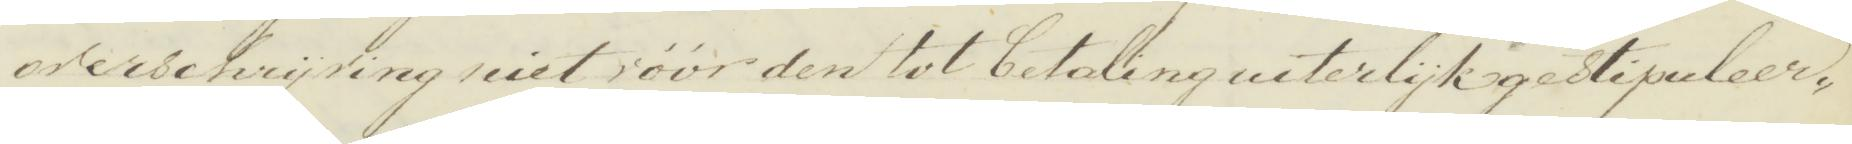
overschrijving niet vóór den tot betaling uiterlijk gestipuleer„
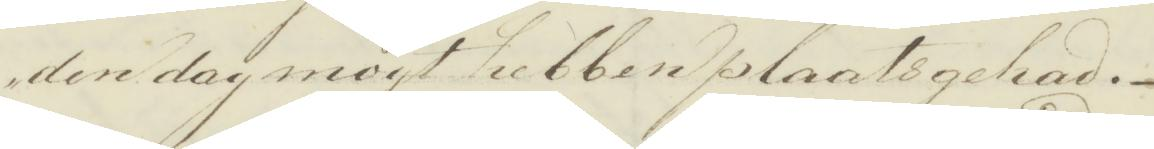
„den dag mogt hebben plaatsgehad.—
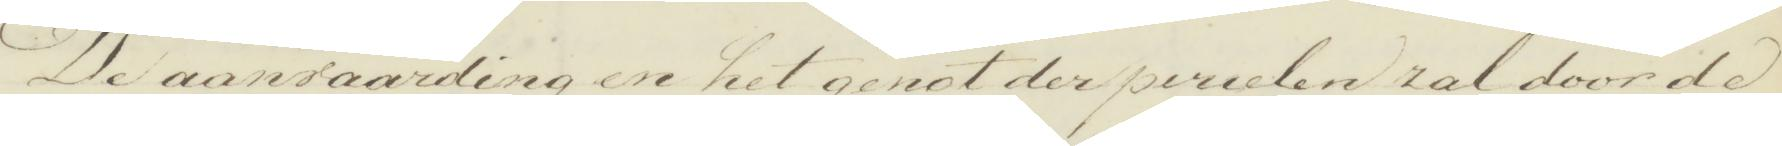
De aanvaarding en het genot der percelen zal door de
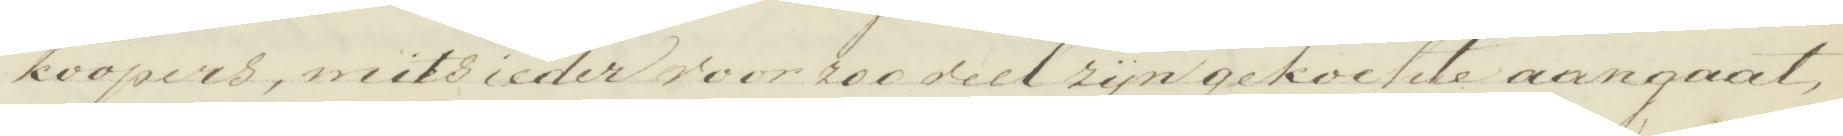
koopers, mits ieder voor zoo veel zijn gekochte aangaat,
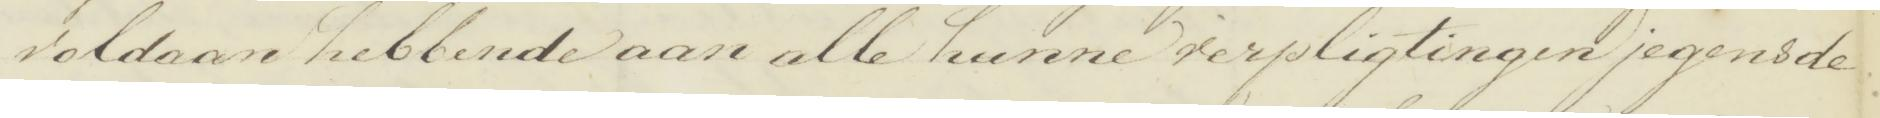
voldaan hebbende aan alle hunne verpligtingen jegens de
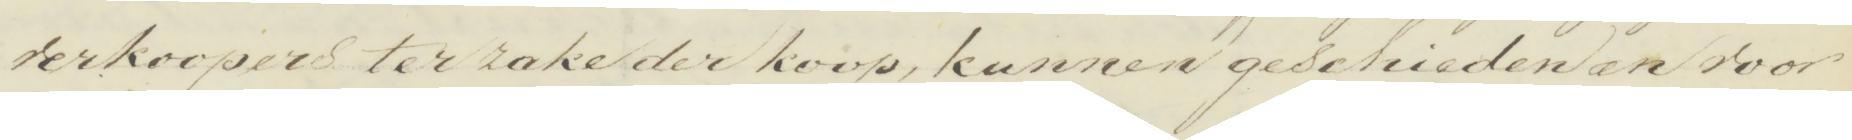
verkoopers ter zake der koop, kunnen geschieden en voor
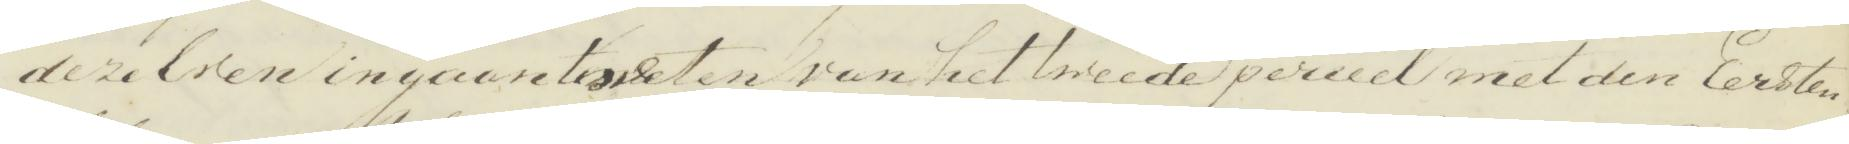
dezelven ingaan teweten van het tweede perceel met den Eersten
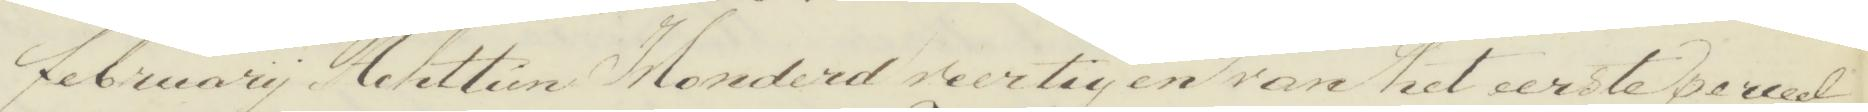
februarij Achttien Honderd veertig en van het eerste perceel
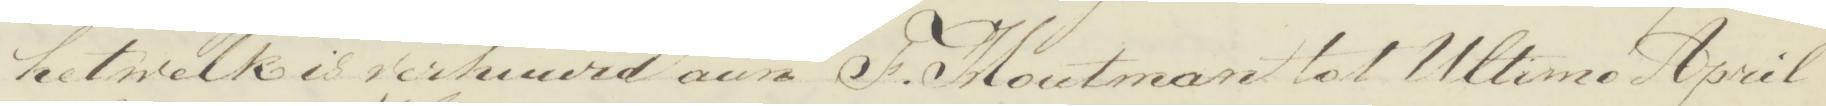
hetwelk is verhuurd aan F: Houtman tot Ultimo April
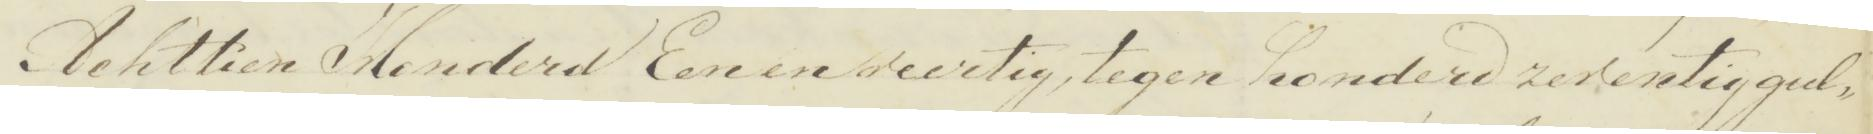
Achttien Honderd Een en veertig, tegen honderd zeventig gul„
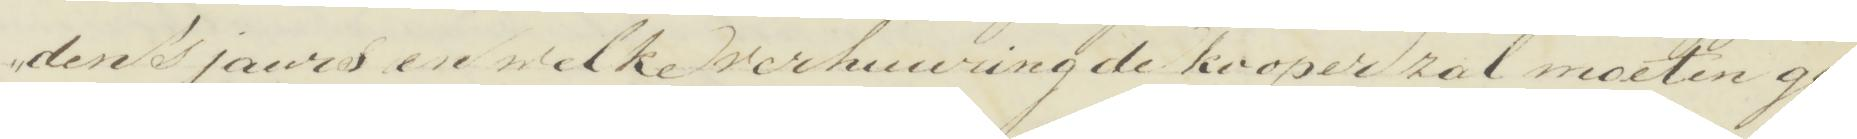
„den 's jaars en welke verhuuring de kooper zal moeten ge
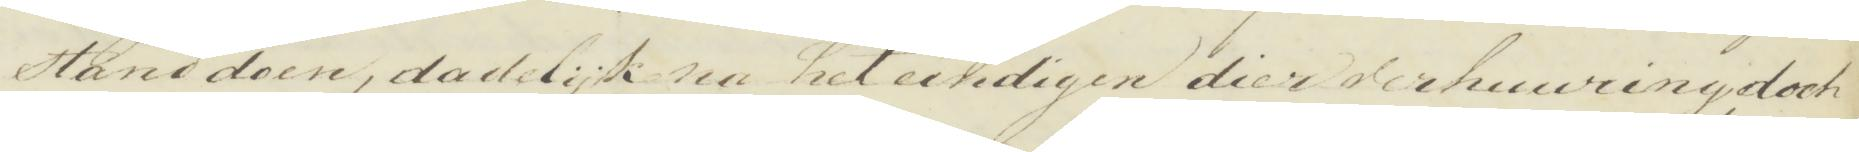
stand doen, dadelijk na het eindigen dier verhuuring doch
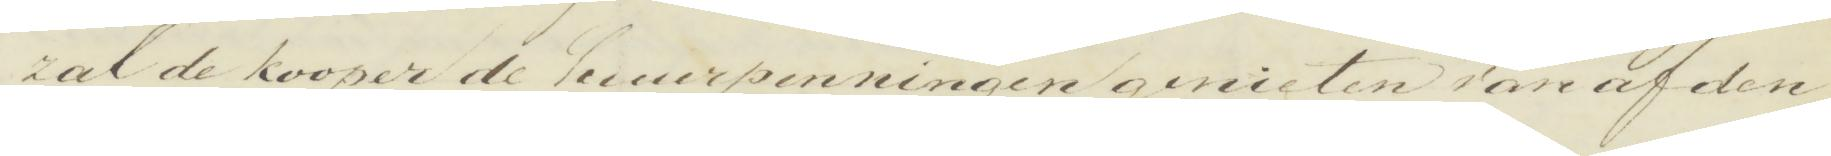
zal de kooper de huurpenningen genieten van af den
